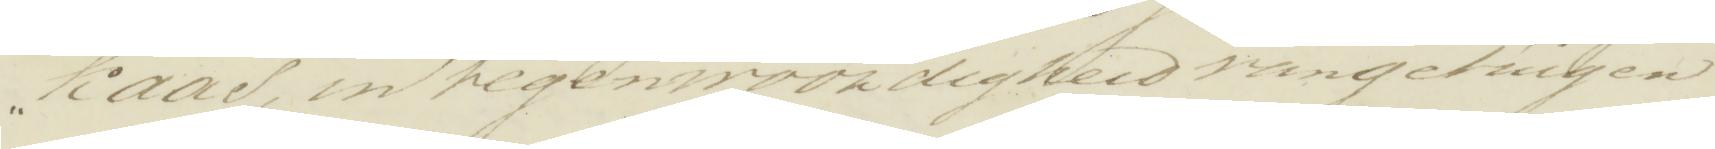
„kaas, in tegenwoordigheid van getuigen
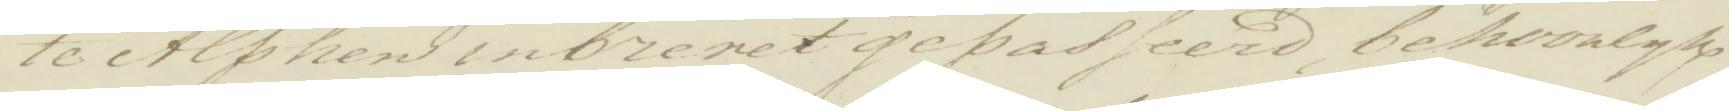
te Alphen in brevet gepasseerd, behoorlyk
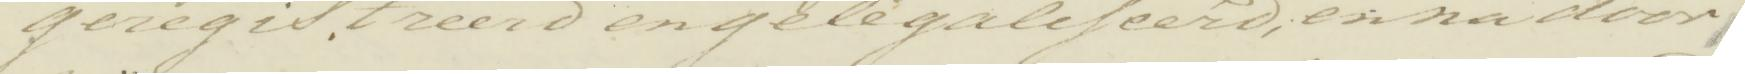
geregistreerd en gelegaliseerd, en na door
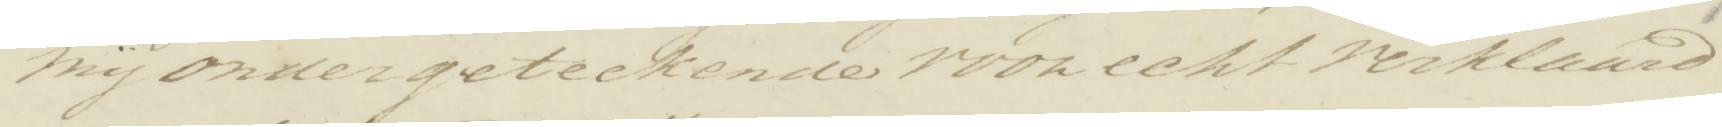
mij ondergeteekende voor echt verklaard
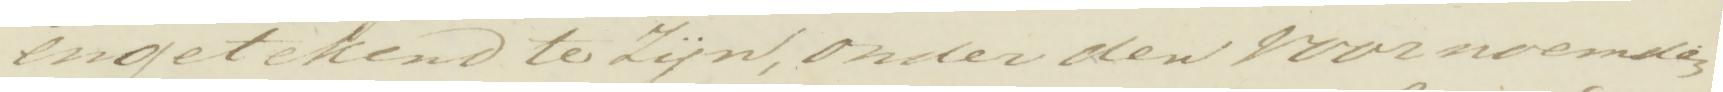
en getekend te zijn, onder den voornoemden
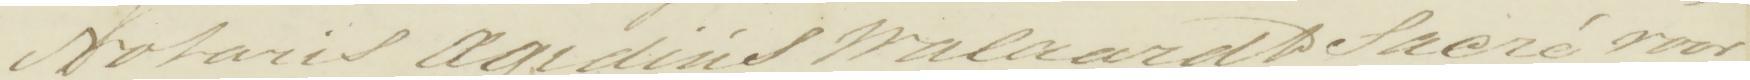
Notaris Agidius Walaardt sacré voor
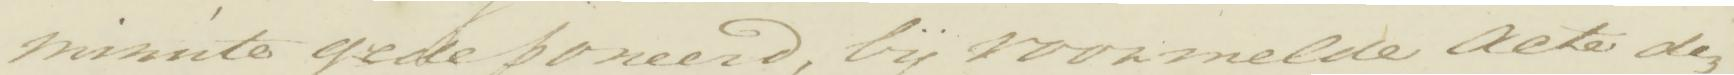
minute gedeponeerd, bij voormelde acte den
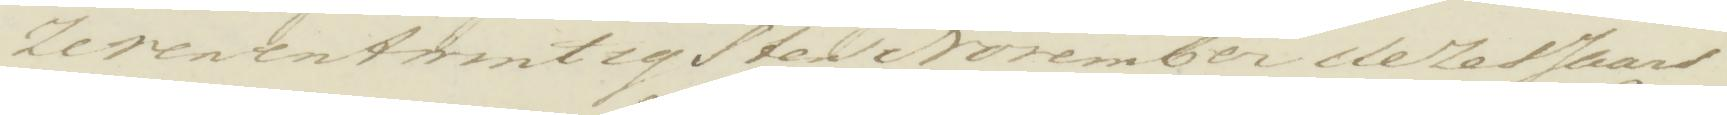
zeven en twintigsten November dezes Jaars
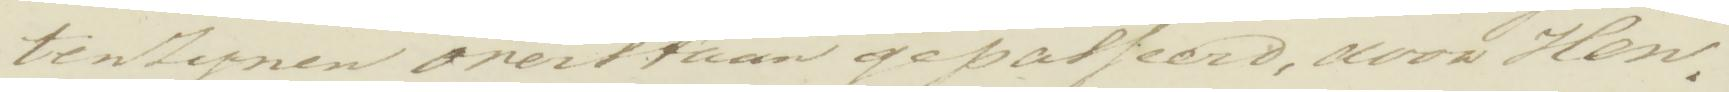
ten zynen overstaan gepasseerd, door Hen„
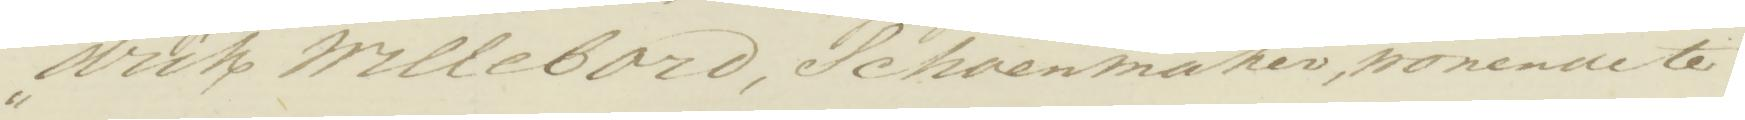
„drik Willebord, schoenmaker, wonende te
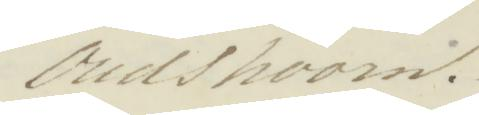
Oudshoorn.
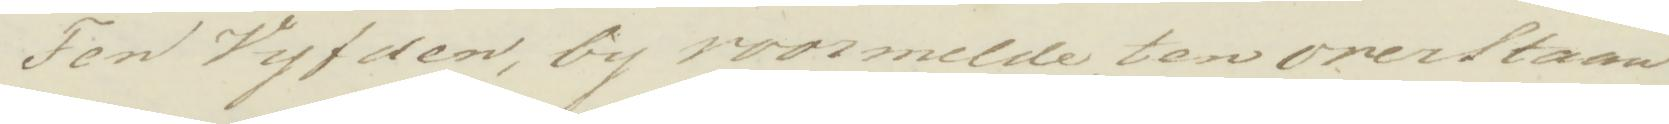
Ten Vyfden, by voormelde ten overstaan
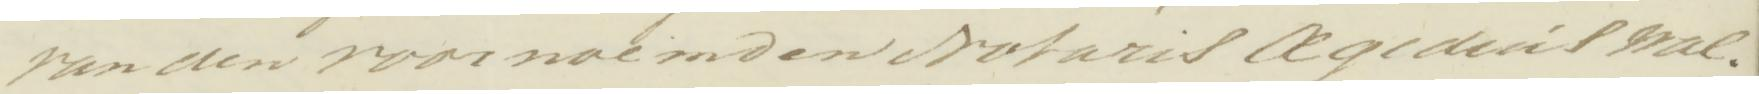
van den voornoemden Notaris Agidius Wal„
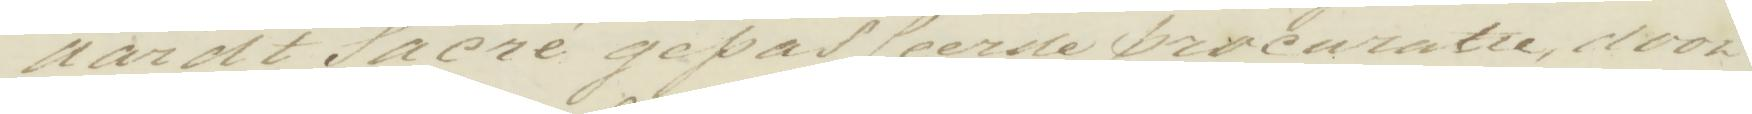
aardt sacré gepasseerde procuratie, door
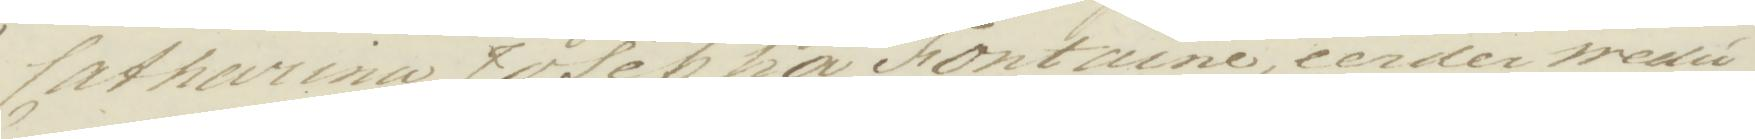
Catharina Josepha Fontaine, eerder wedu
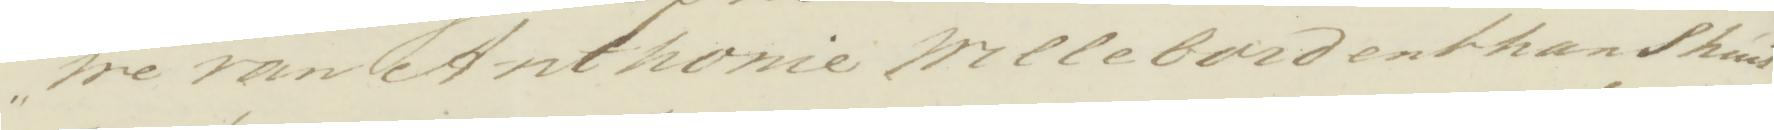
„we van Anthonie Willebord en thans huis
